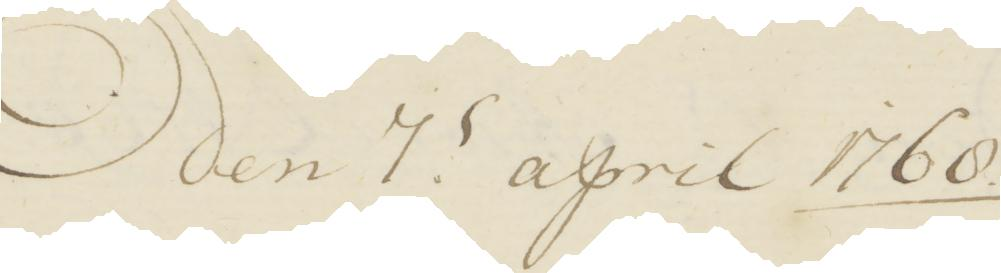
den 7.' april 1768.
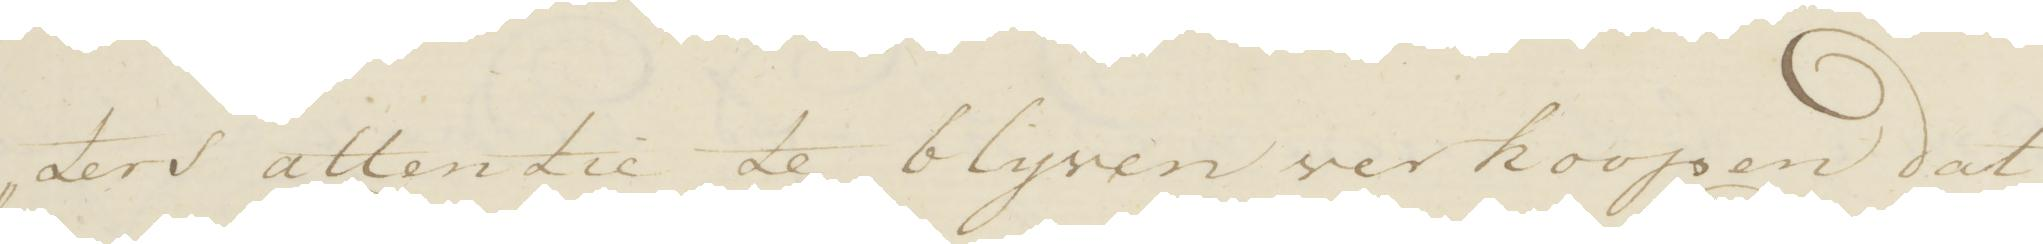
„ters attentie te blijven verhoopen dat
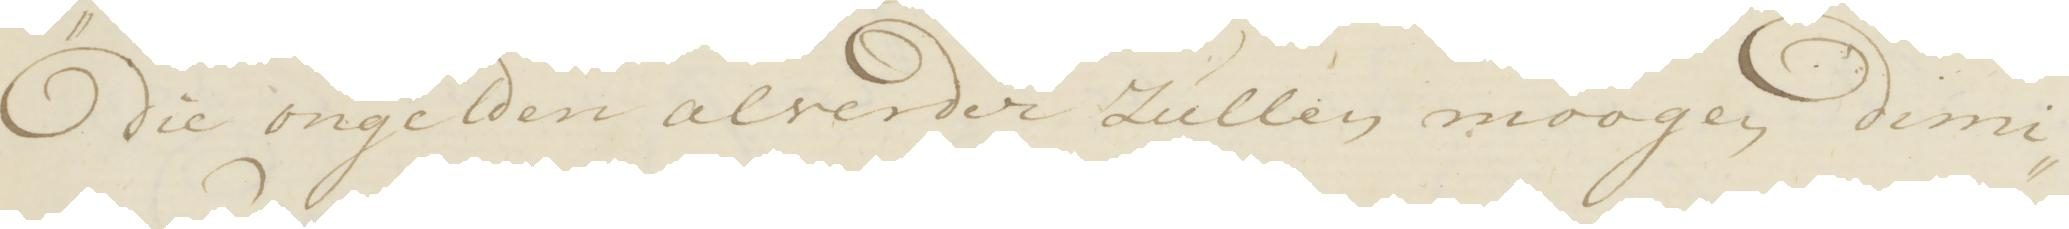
die ongelden alverder zullen moogen dimi„
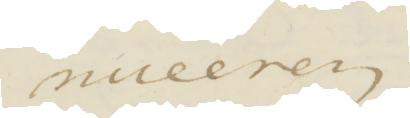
nueeren
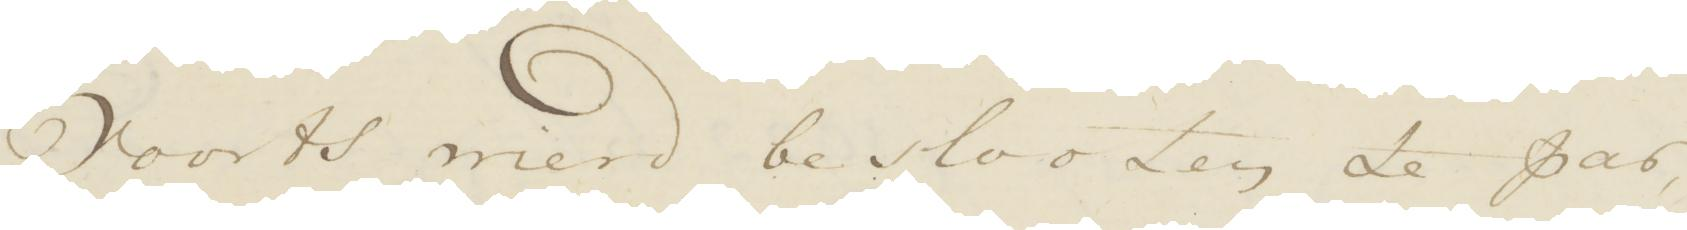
Voorts wierd beslooten te pas,
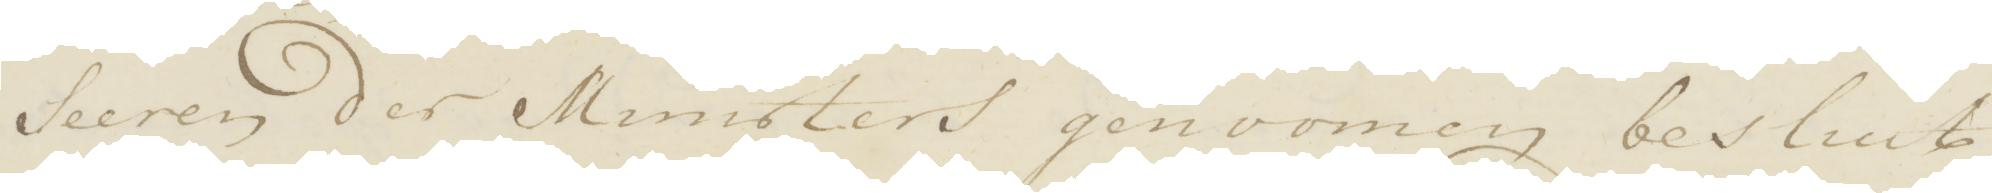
seeren der Ministers genoomen besluit
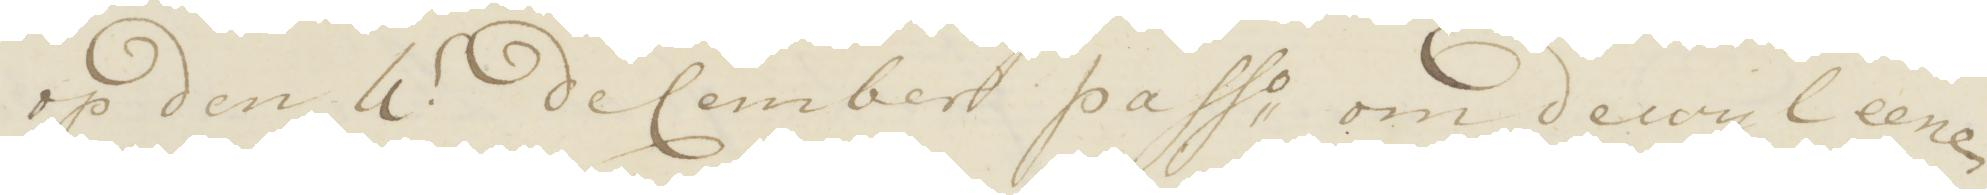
op den 4.' december pass„o om dewijl eenen
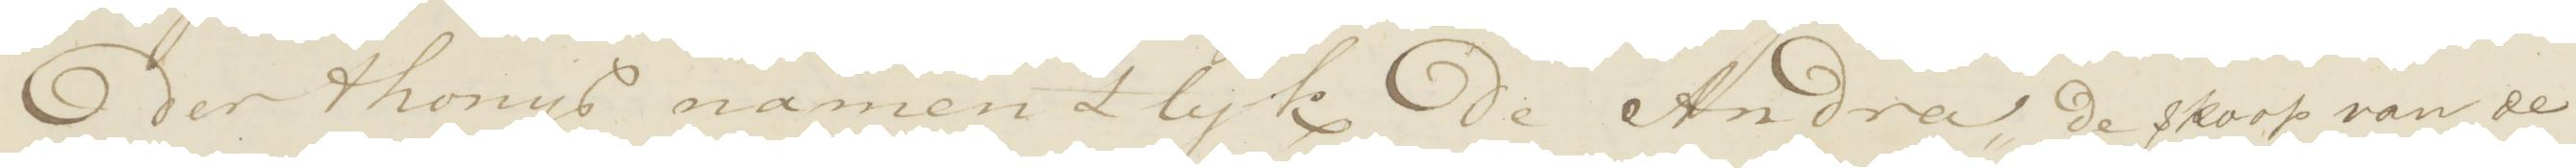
der thonijs namentlijk de Andra„ de verkoop van de
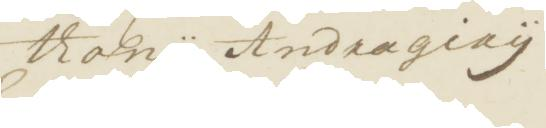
thanij Andragirij
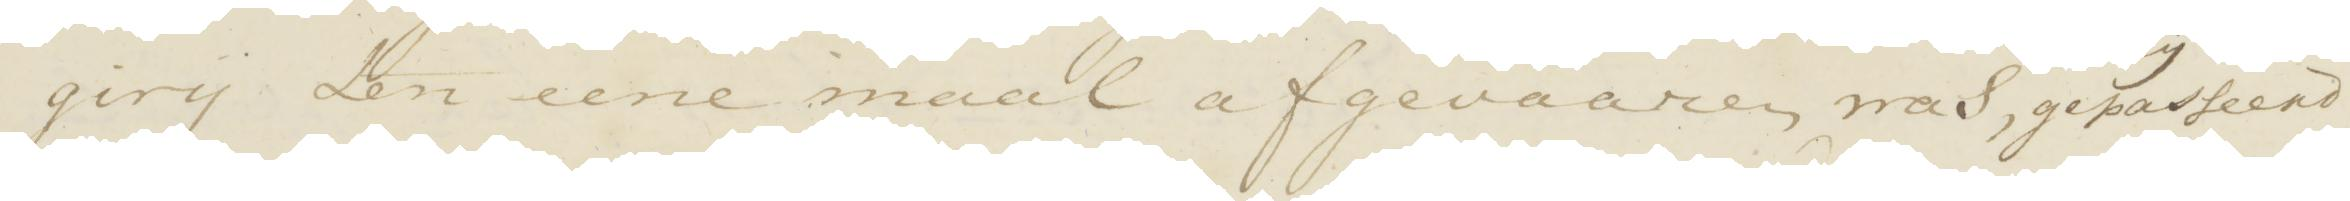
girij ten eene maal afgevaaren was, gepasseerd
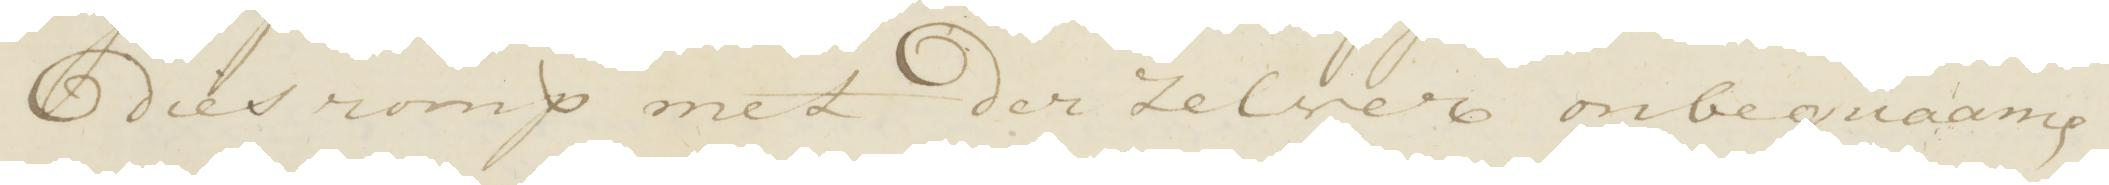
dies romp met der zelver onbequaamen
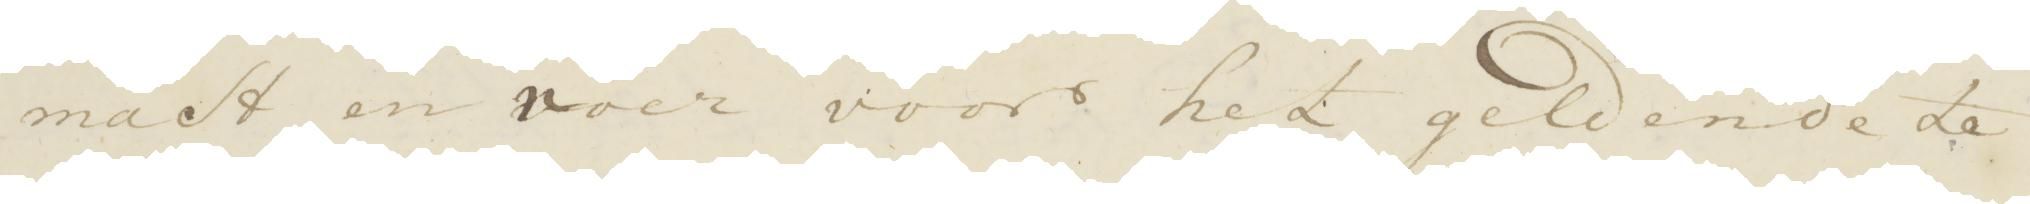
mast en voer voors het geldende te
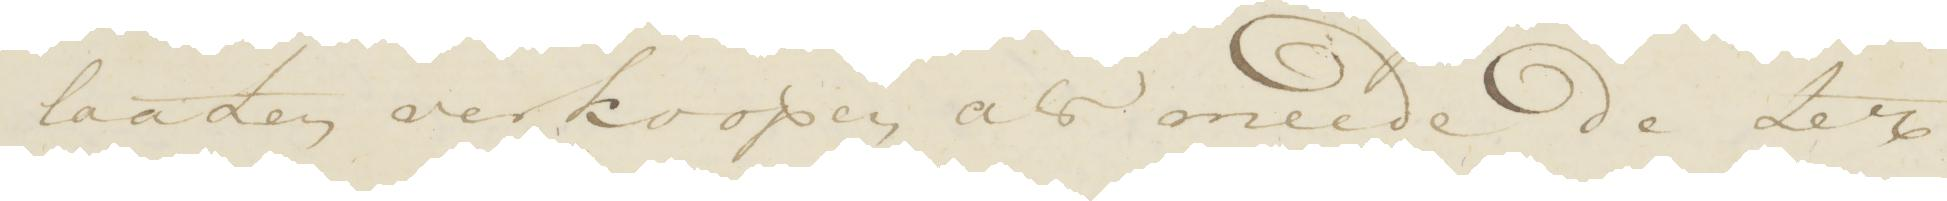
laaten verkoopen als meede de ter
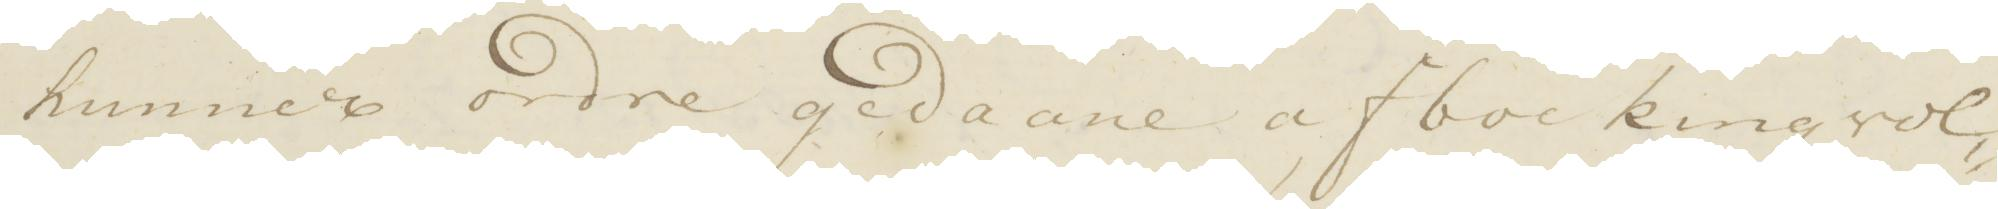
hunner ordre gedaane afboeking vol„
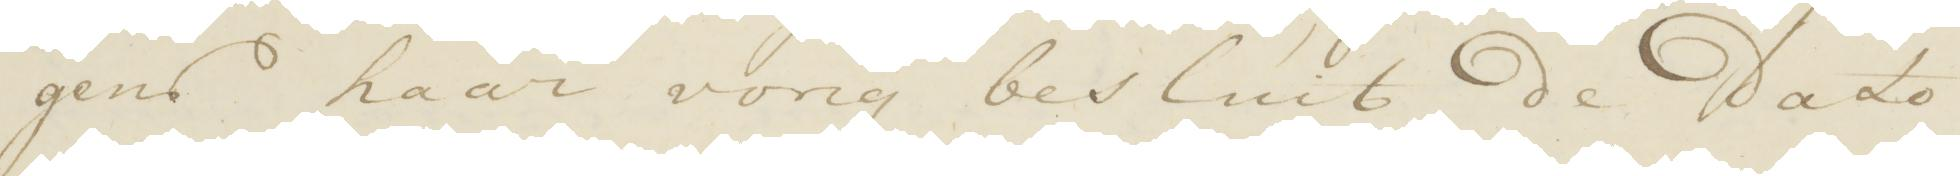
gens haar vorig besluit de dato
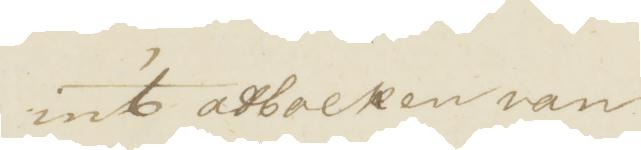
in’t afboeken van
